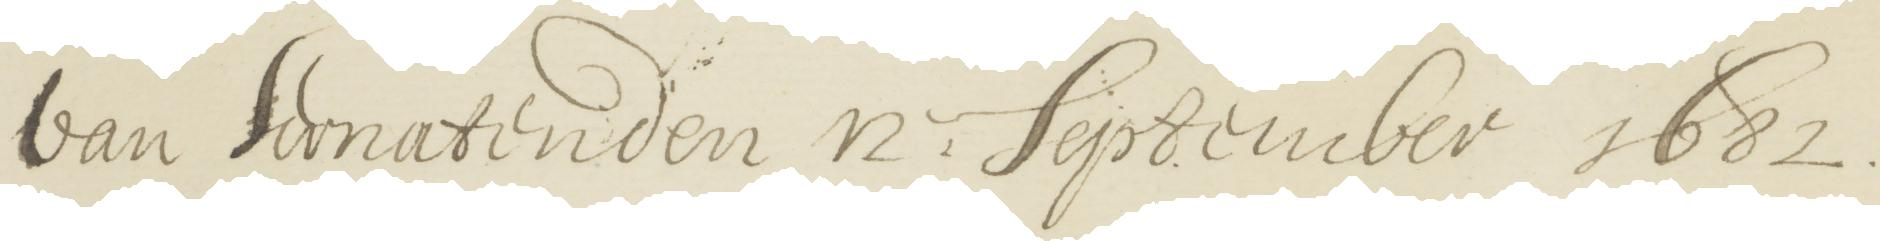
van ternaten den 12:' September 1682.
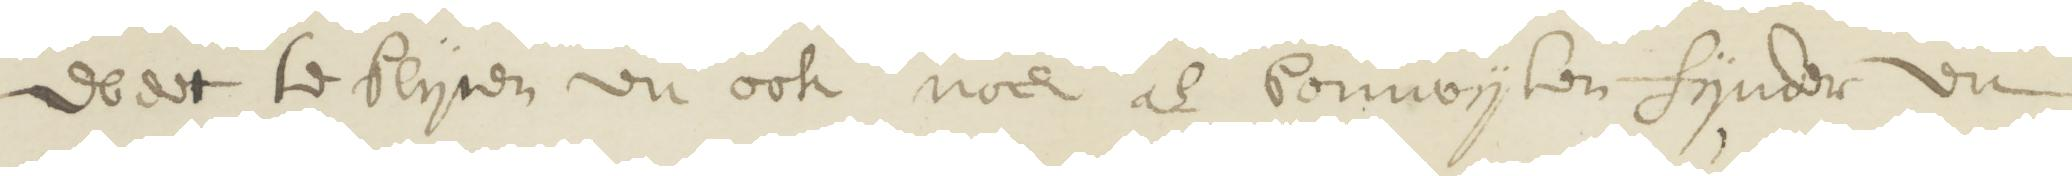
weet te slijten en ook noch al somwijlen fijnder en
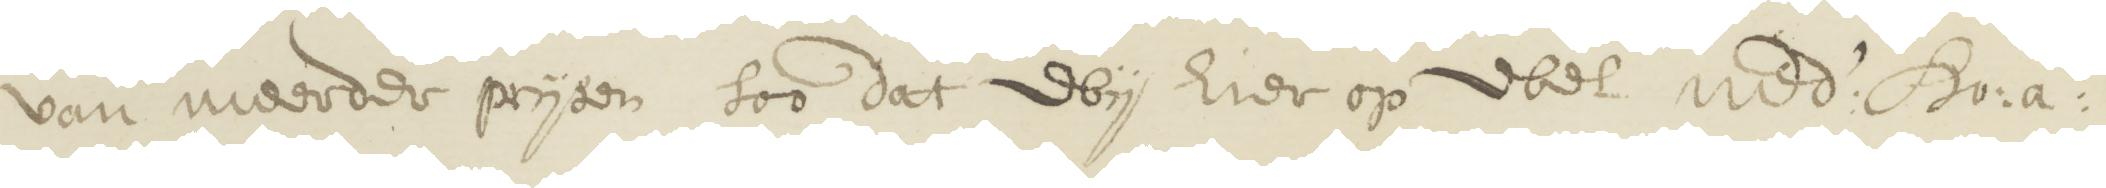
van meerder prijsen soo dat wij hier op wel uEd:' Ho: a:
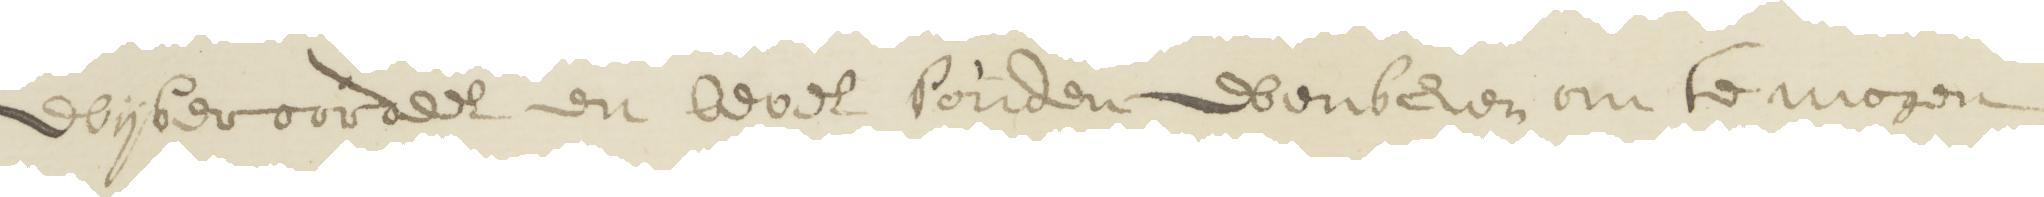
wijser oordeel en bevel souden wenschen om te mogen
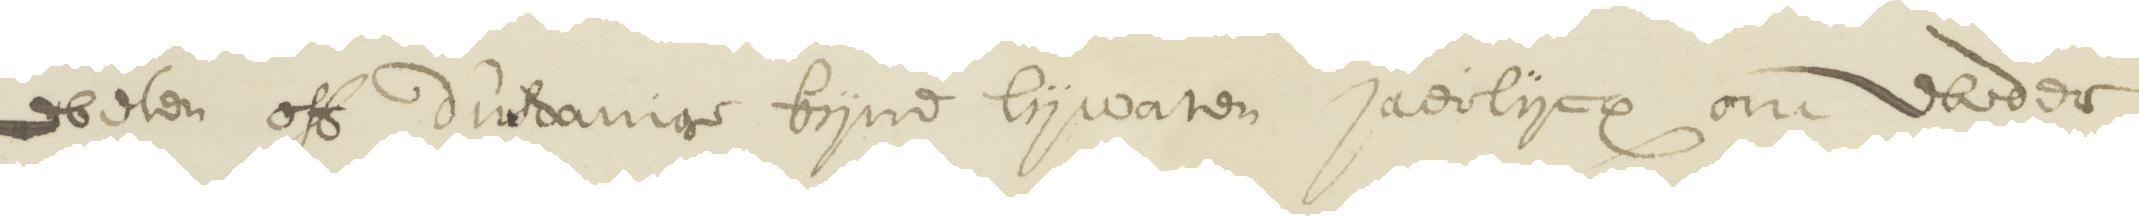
weten off dusdanige fijne lijwaten jaerlijcx om weder
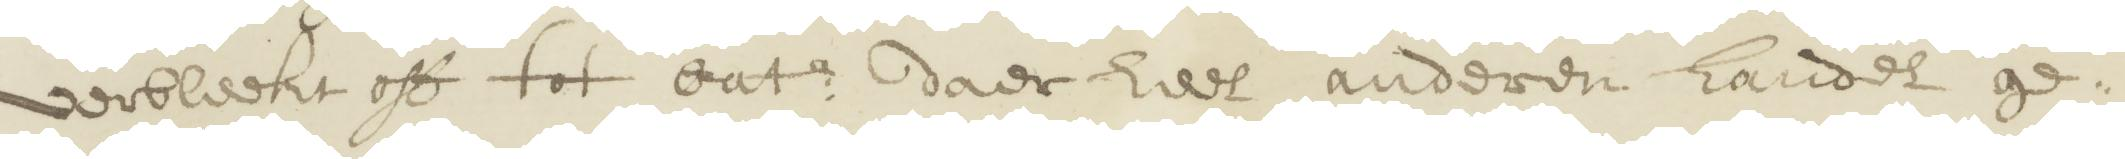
verbleekt off tot bat:a daer heel anderen handel ge„
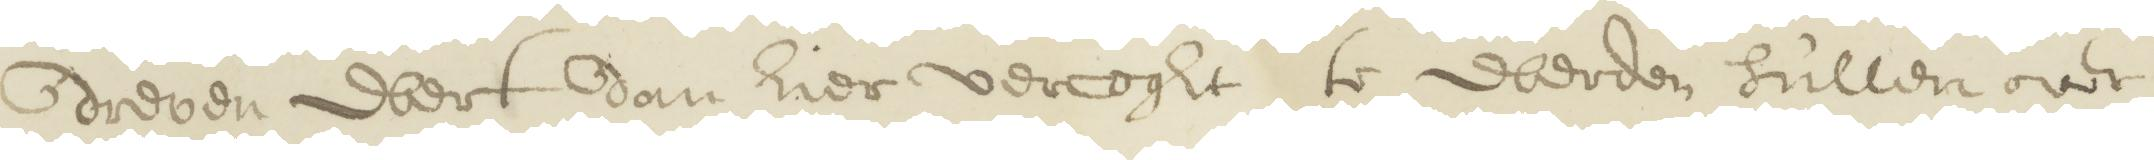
dreven wert dan hier vercoght te werden sullen over
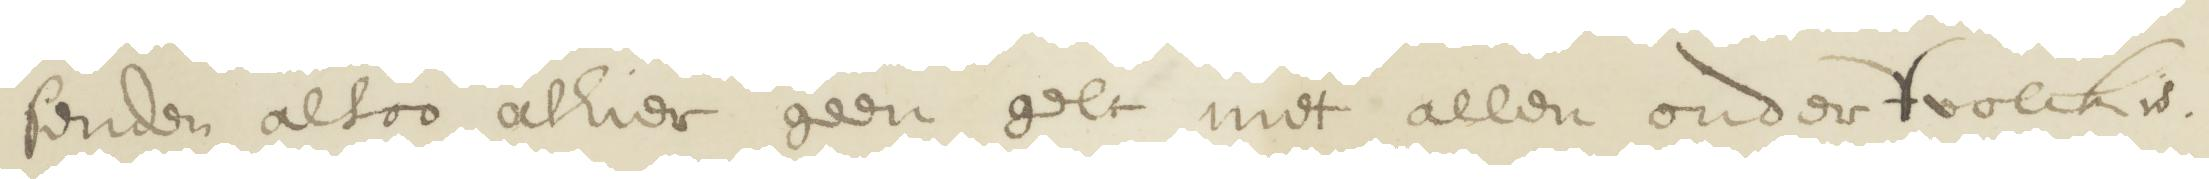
senden alsoo alhier geen gelt met allen onder 't volck is.
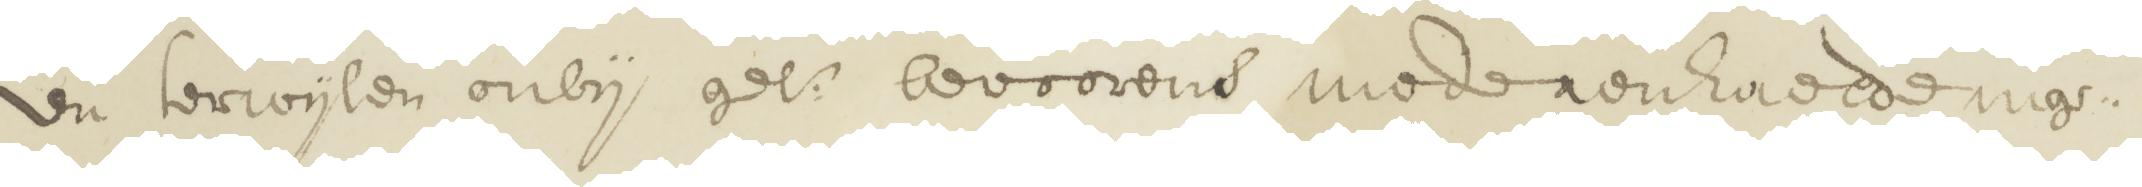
en terwijlen oubij gelijk bevoorens mede aenhaelde inge:
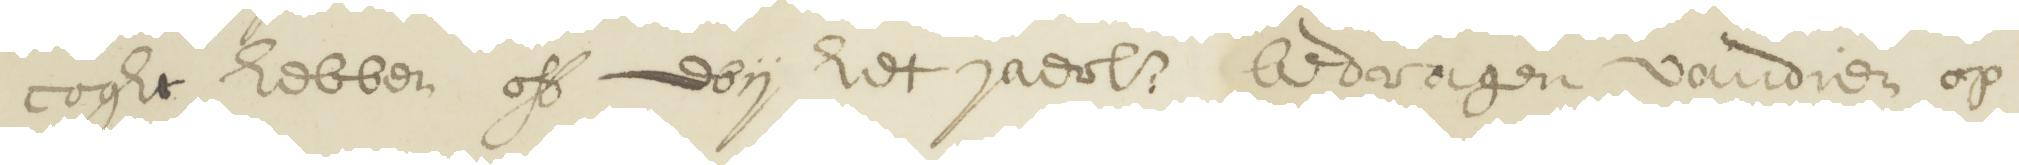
coght hebben off wij het jaerlijk bedragen vandien op
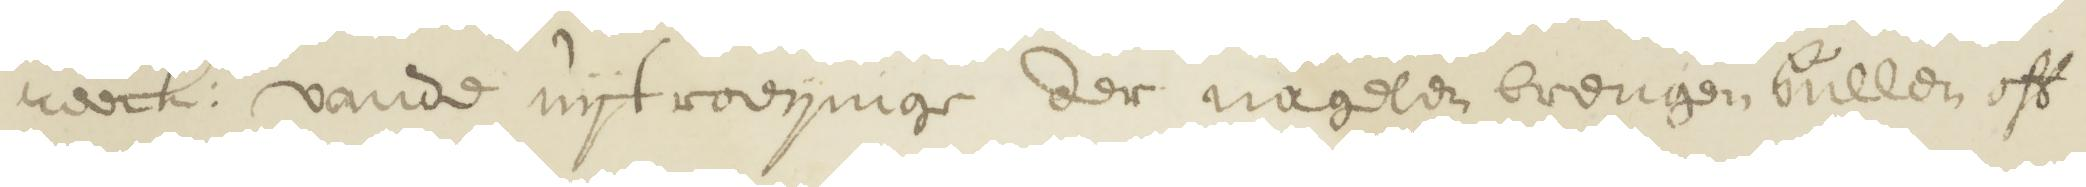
reeck: vande uijtroeijinge der nagelen brengen sullen off
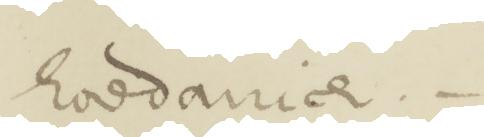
hoedanich. —
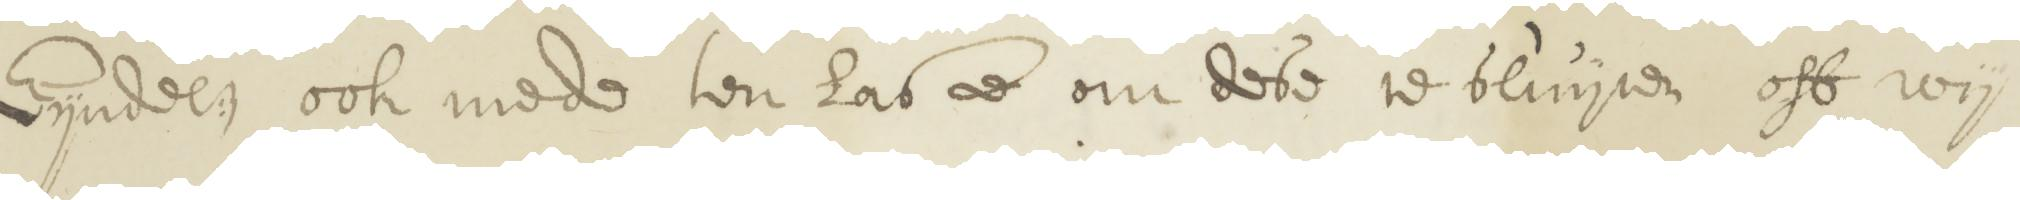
Eijndelijk ook mede ten laste om dese te sluijten off wij
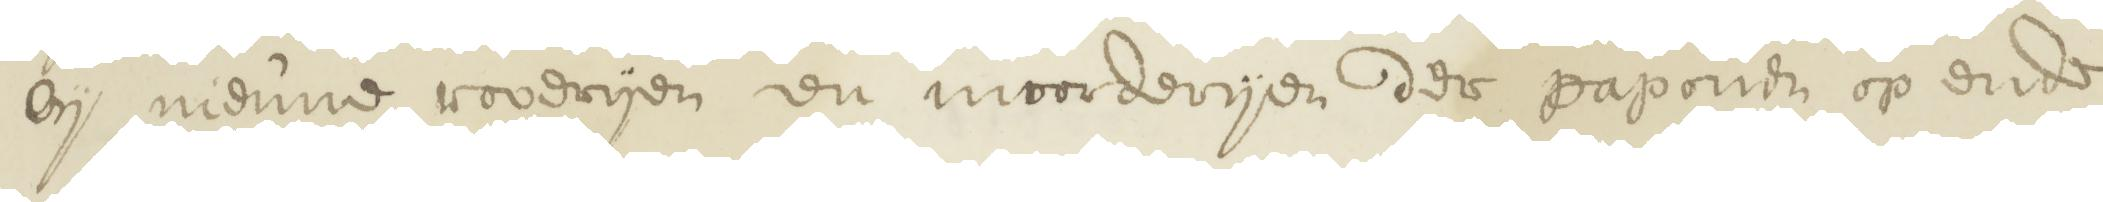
bij nieuwe roverijen en moorderijen der papouen op ende
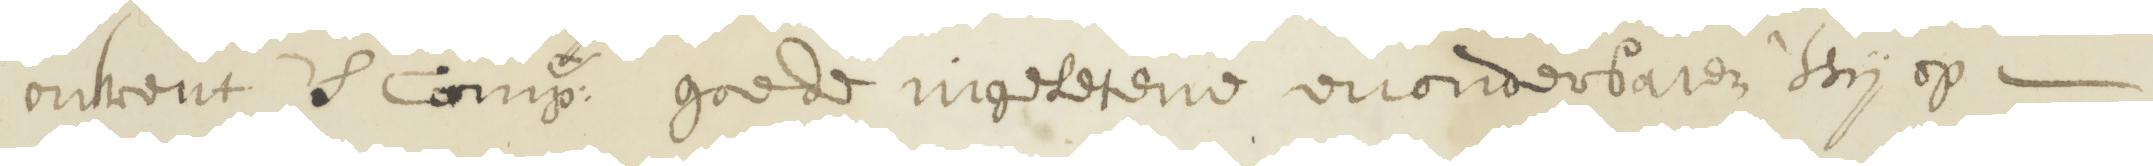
ontrent ’s Comp: goede ingesetene en ondersaten 't sij op —
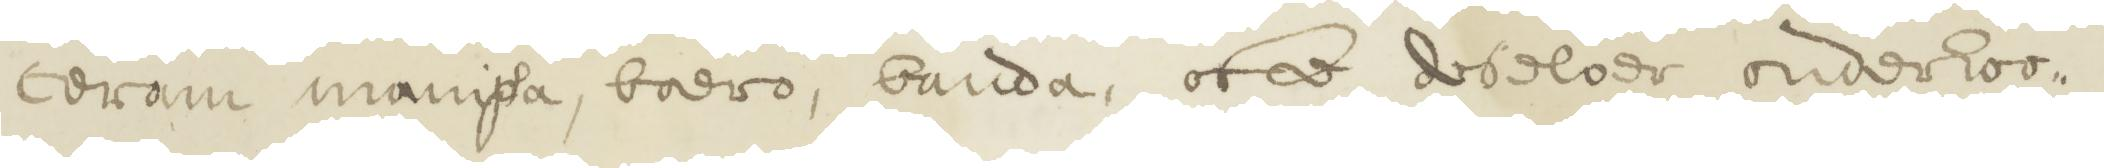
ceram manipsa, boero, banda, ofte deselver onderhoo„
